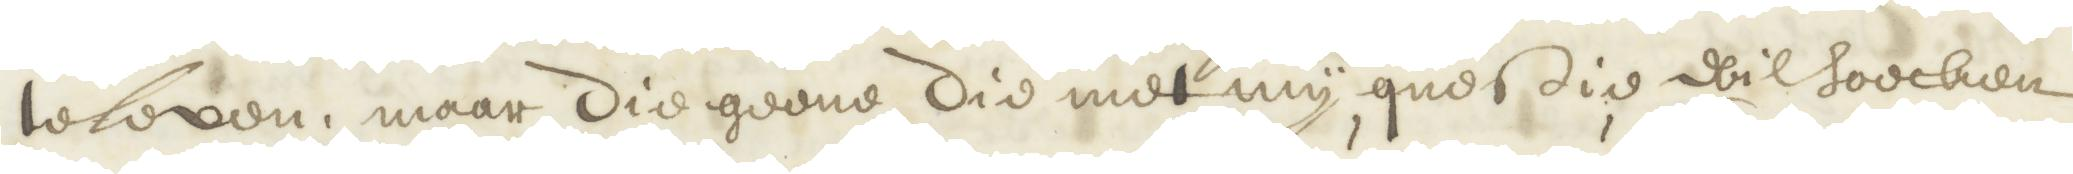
te leven, maar die geene die met mij questie wil soecken
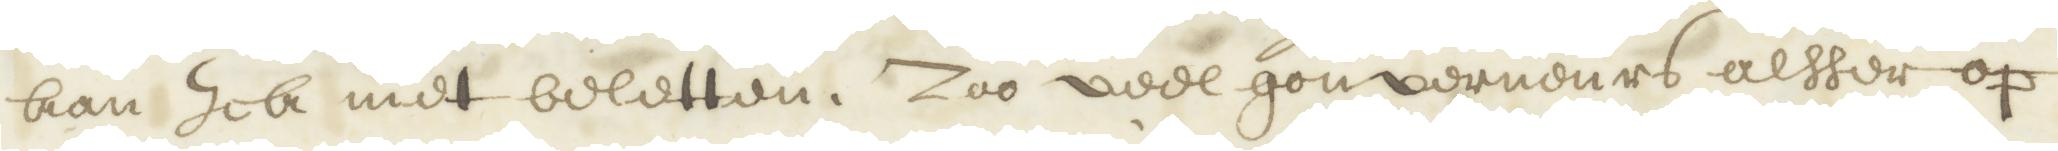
kan Jck niet beletten. Zoo veel gouverneurs alsser op
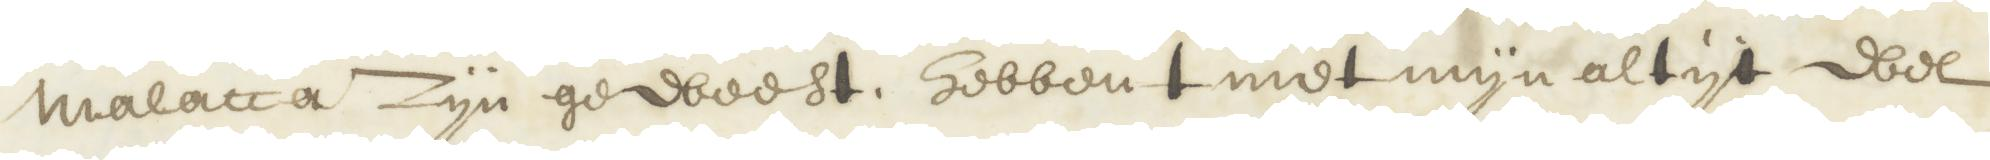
malacca zijn geweest, hebben 't met mijn altijt wel
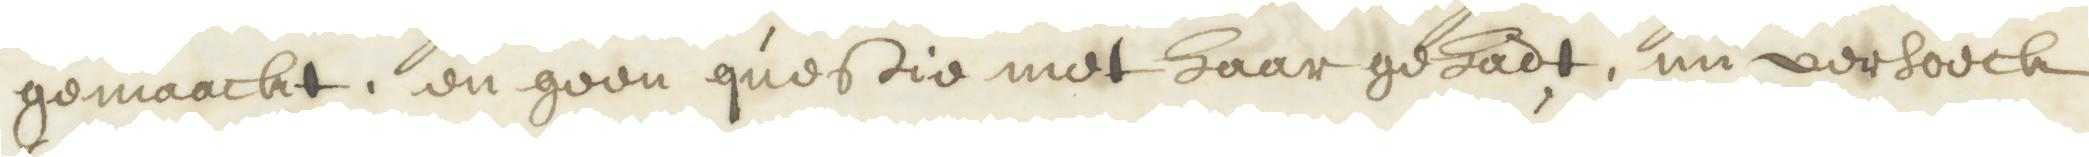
gemaackt, en geen questie met haar gehadt, nu versoeck
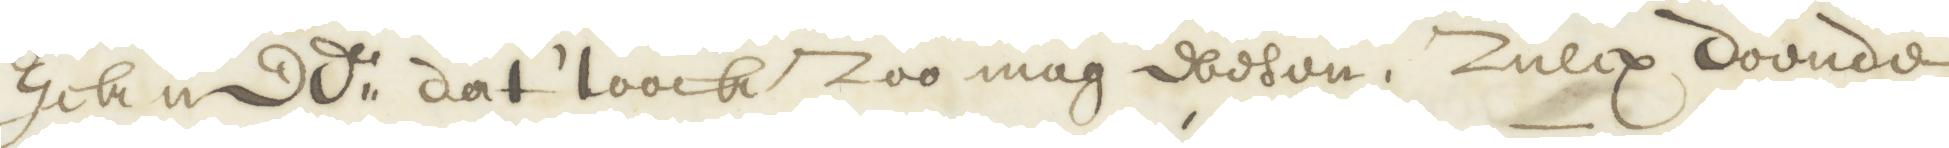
Jck u Ed:le dat 't oock zoo mag wesen, zulcx doende
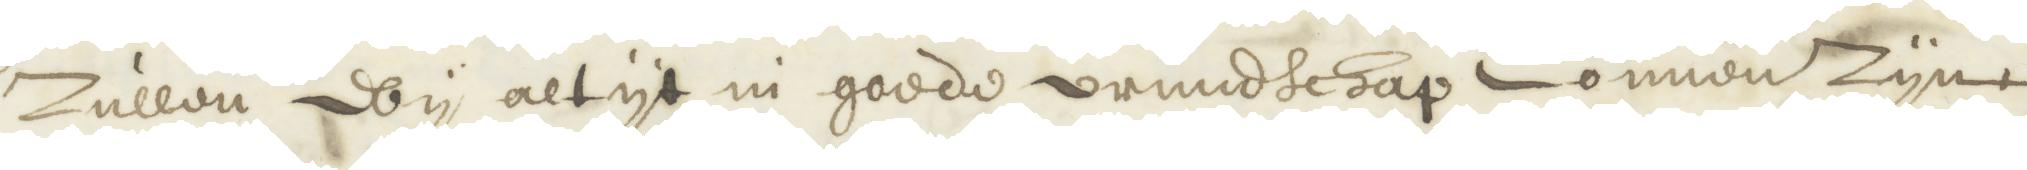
zullen wij altijt in goede vrundschap connen zijn,
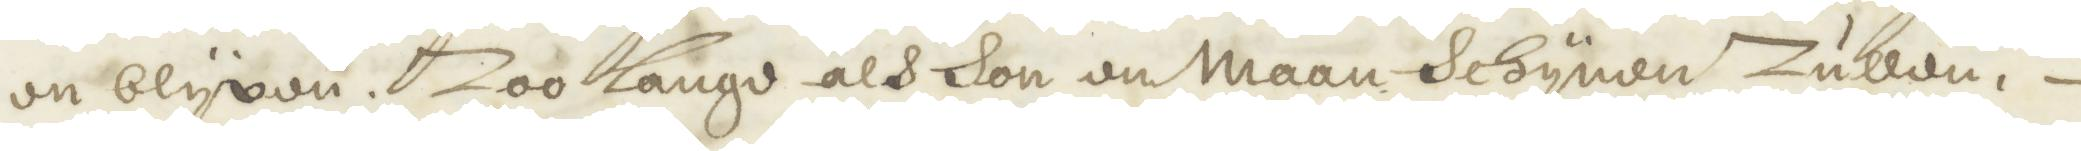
en blijven. Zoo lange als son en maan schijnen zullen,
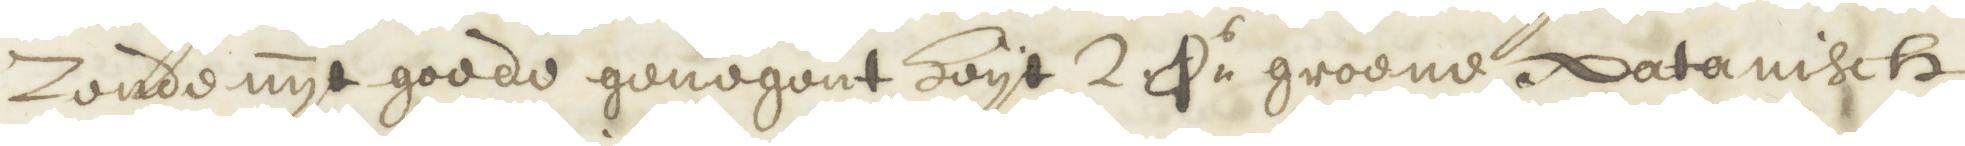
zende uyt goede genegentheijt 2 p„s groene patanisch
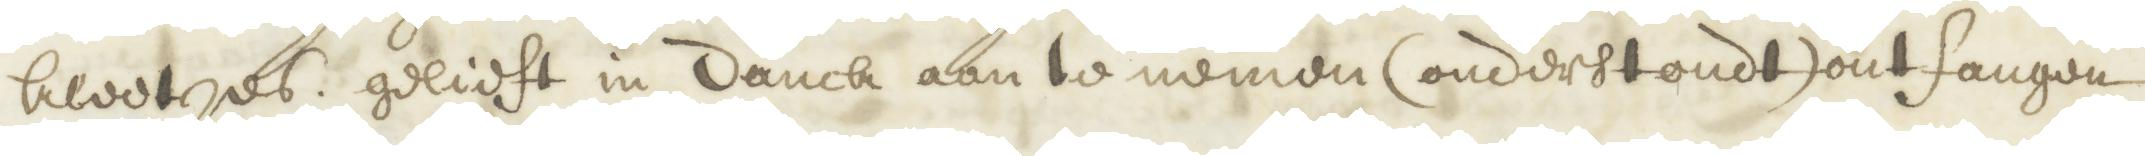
kleetjes. gelieft in danck aan te nemen (onderstondt) ontfangen
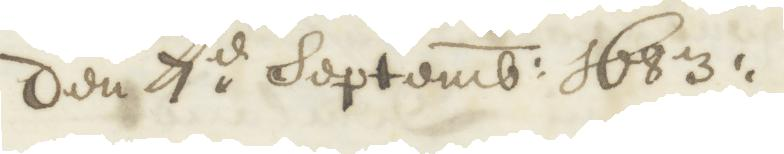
den 7„e Septemb: 1683:
